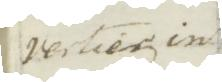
vertier in
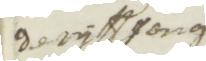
de vijff jong
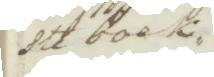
ste boek„
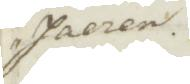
„jaeren
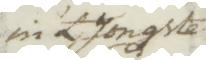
in ’t Jongste
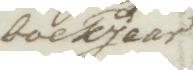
boekjaar
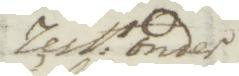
rest:t onder
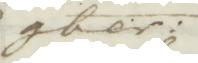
9ber:
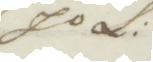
Jo L:
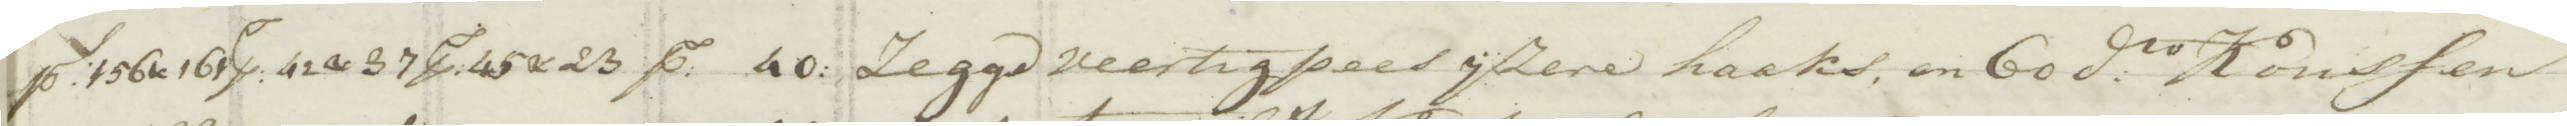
p:s 156 & 161 p:s 42 & 37 p:s 45 & 23 p:s 40: zegge veertig pees ijzere haaks, en 60 d:to Koussen
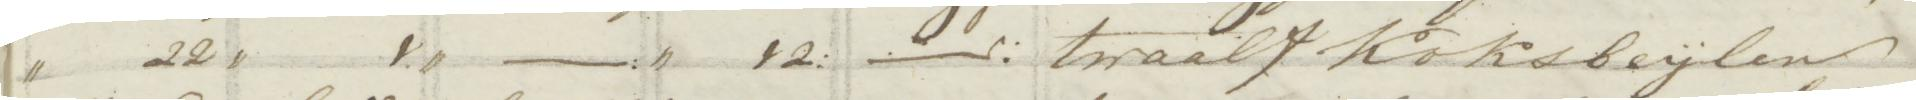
„ 22 „ 1„ —: „ 12: _: twaalf koksbeijlen
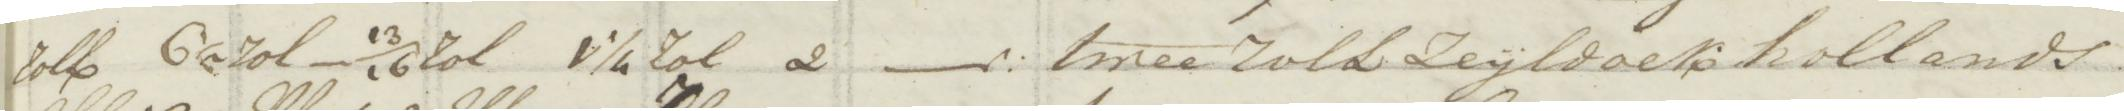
roll 6 1/5 rol — 13/16 rol 1¼ rol 2 _: twee roll zeijldoek hollands
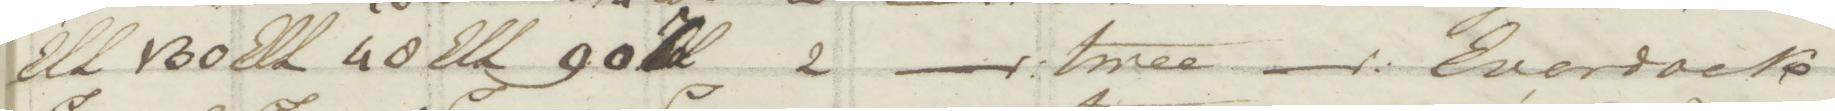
Ell 130 Ell 48 Ell 90 rol 2 _: twee _: Everdoek
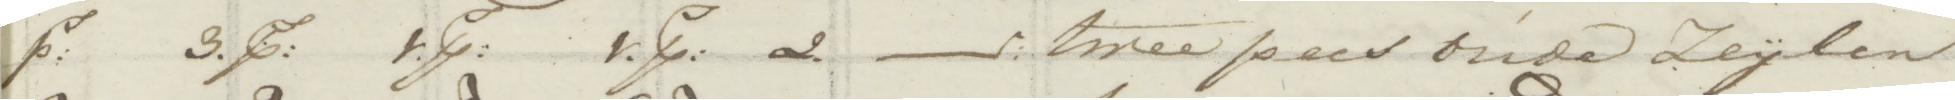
p:s 3. p:s 1. p:s 1. p:s 2. _: twee pees oude zeijlen
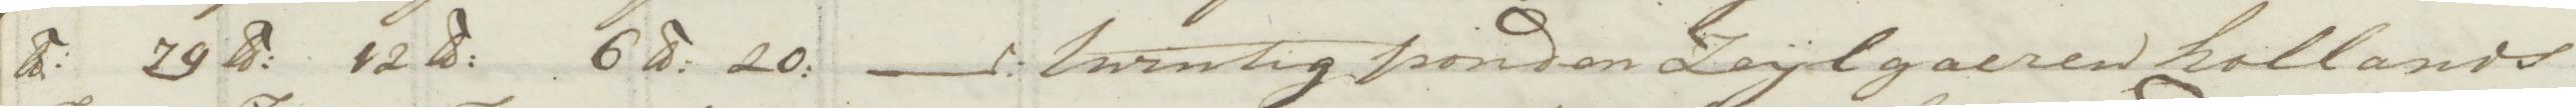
lb: 79 lb: 12 lb: 6 lb: 20. _: twintig ponden zeijlgaeren hollands
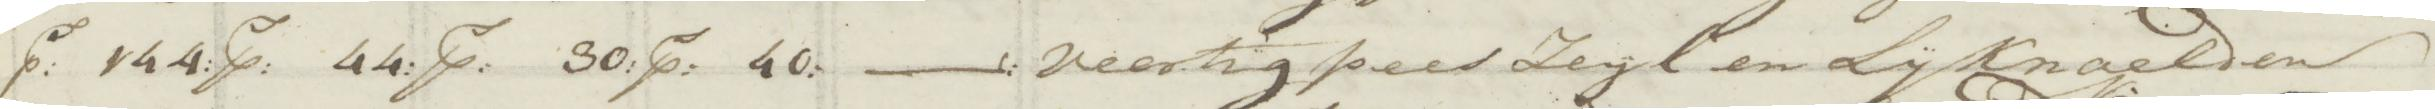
p:s 144: p:s 44: p:s 30: p:s 40: _: veertig pees zeijl en Lijknaelden
